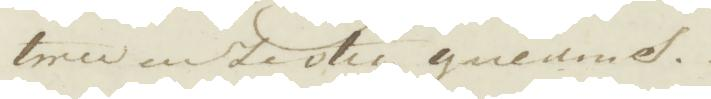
twee en Zestig guldens.
